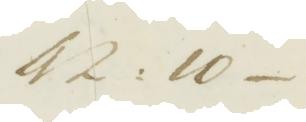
42: 10 —
